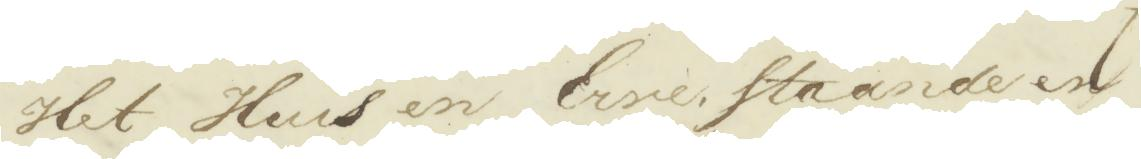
Het Huis en Erve, staande en
